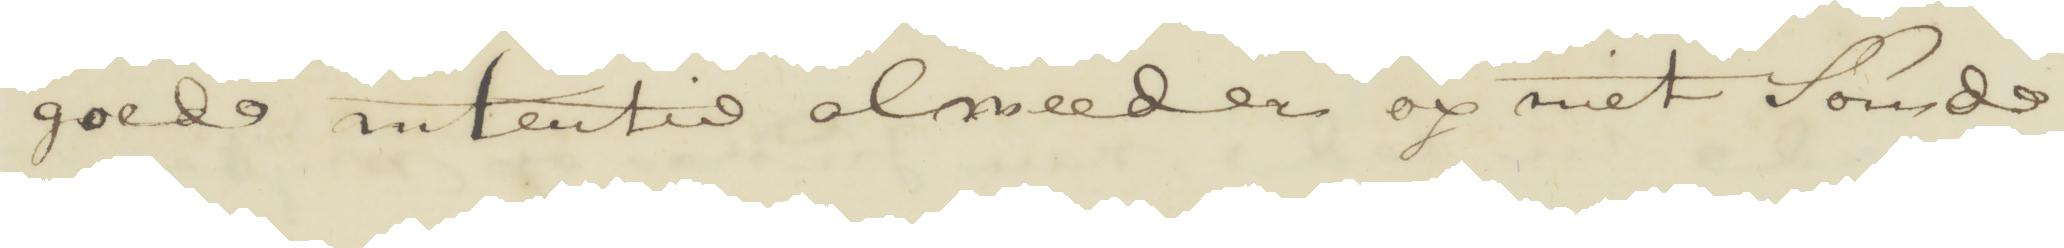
goede intentie alweeder op niet soude
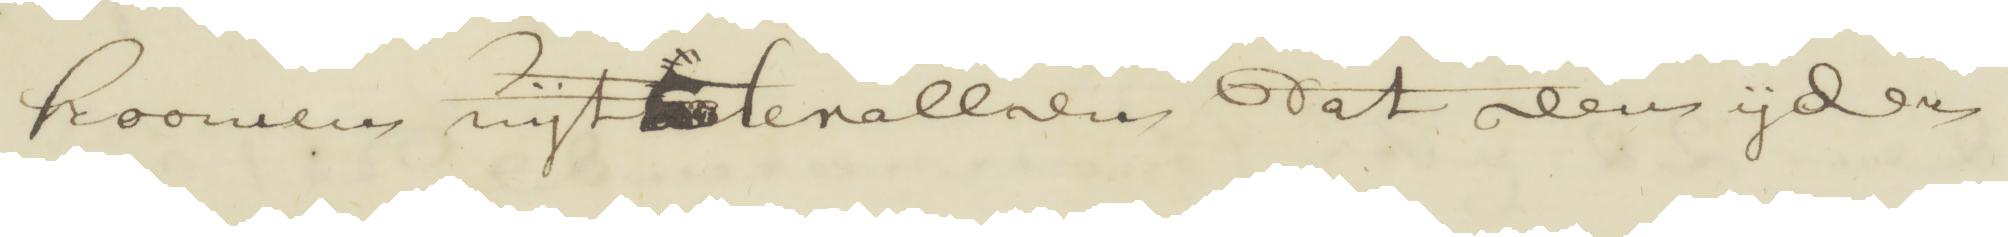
koomen uijttetevallen dat een ijder
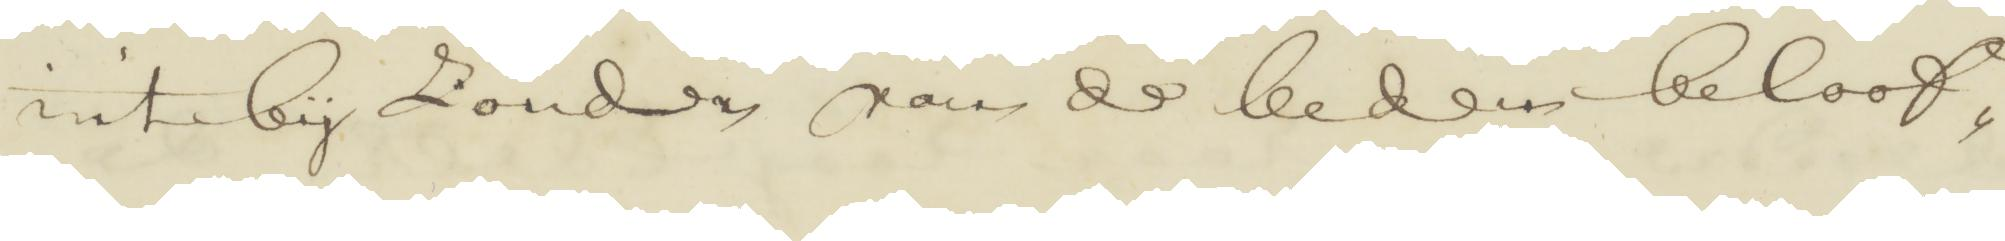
in’t bij zonder van de leeden beloof„
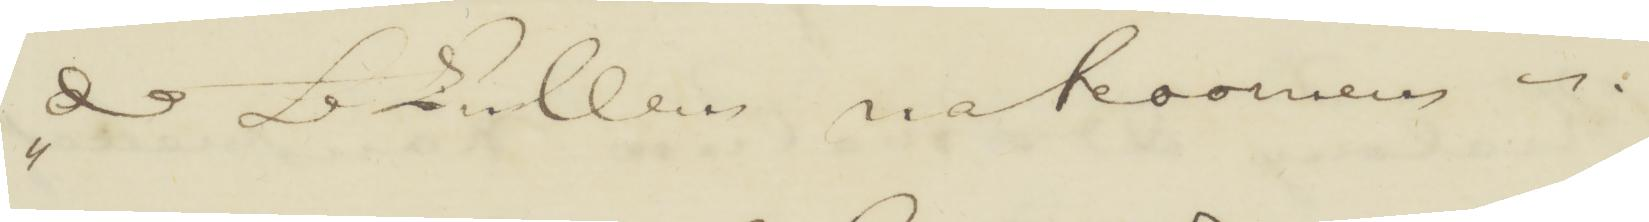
„de te zullen nakoomen ~.
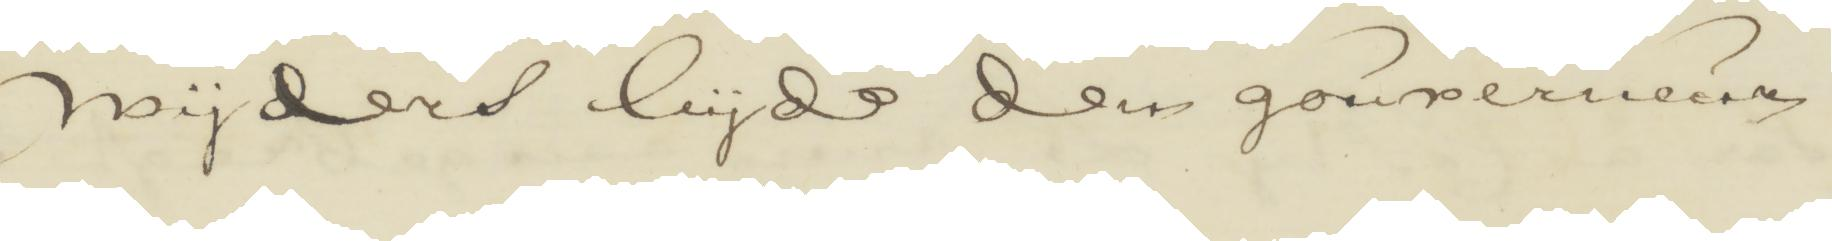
wijders leijde den gouverneur
